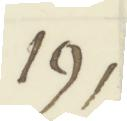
19,
